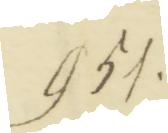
951.
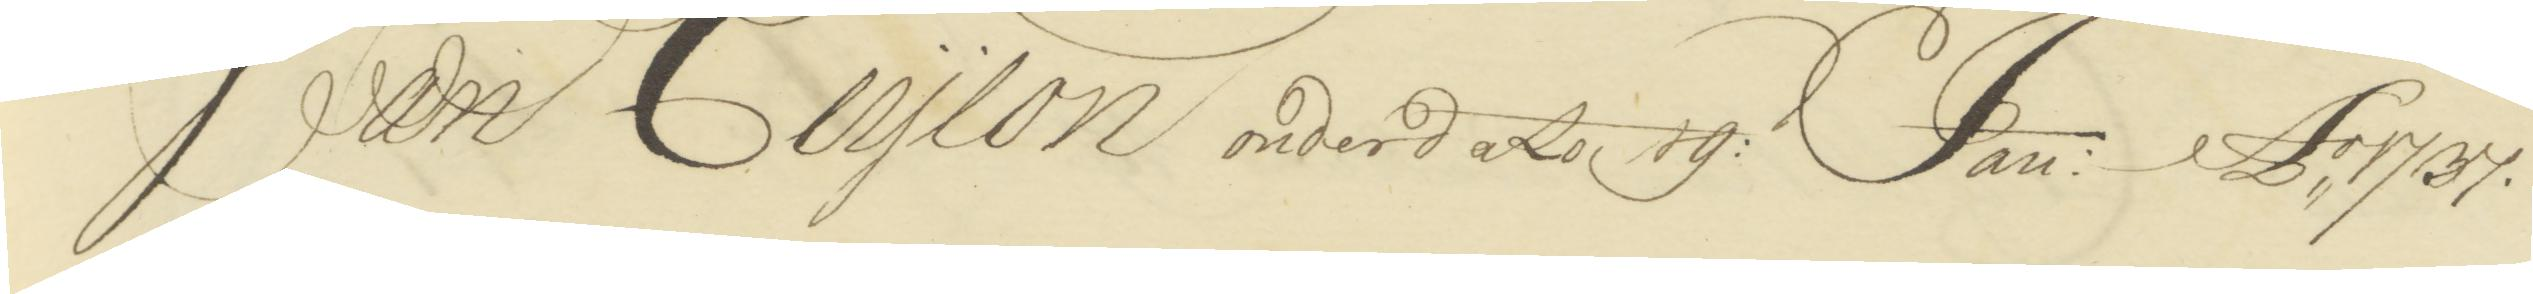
Van Ceijlon onderdato 19:' Ian: A:o 1737.
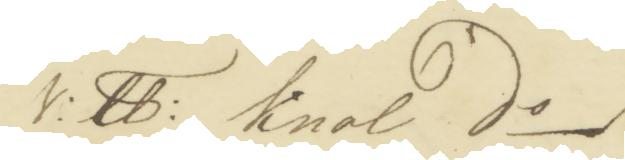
1: lb: knol d-o
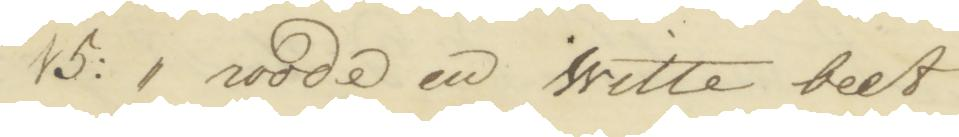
15: „ roode en Witte beet
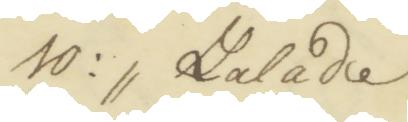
10: „ zalade
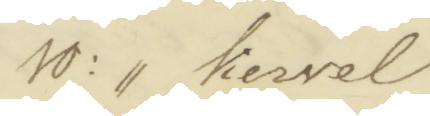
10: „ kervel
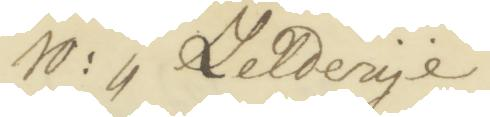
10: „ zelderije
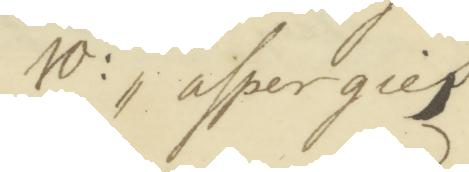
10: „ aspergies
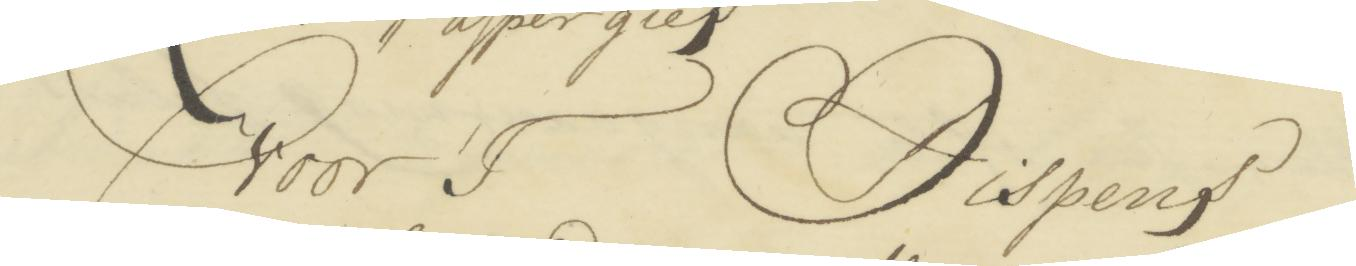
Voor 'T Dispens
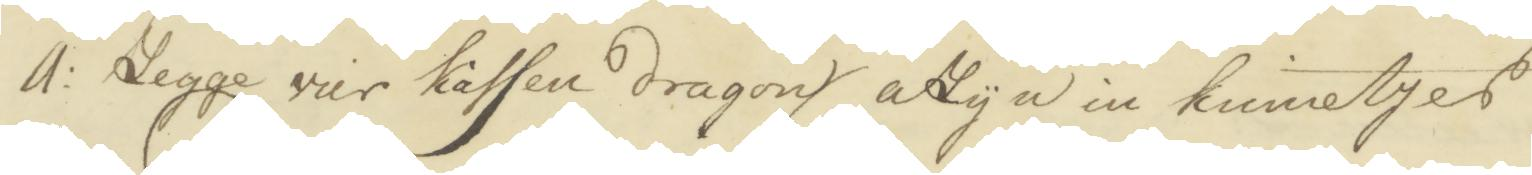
4: zegge vier kassen dragon azijn in kinnetjes
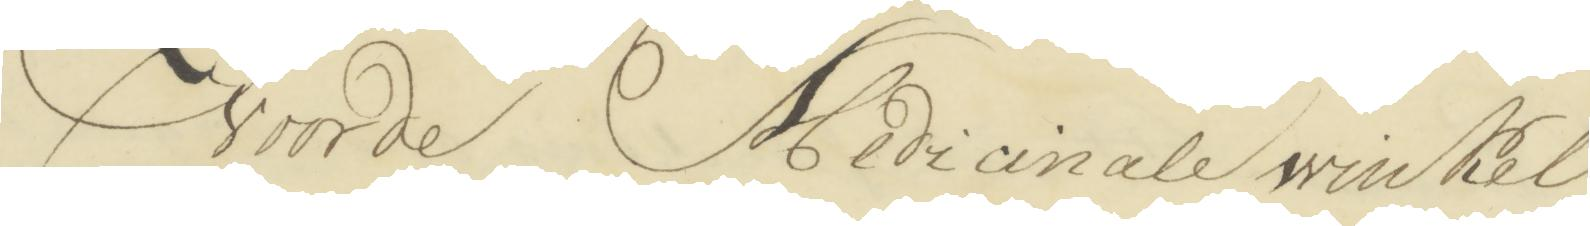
voor de Medicinale winkel
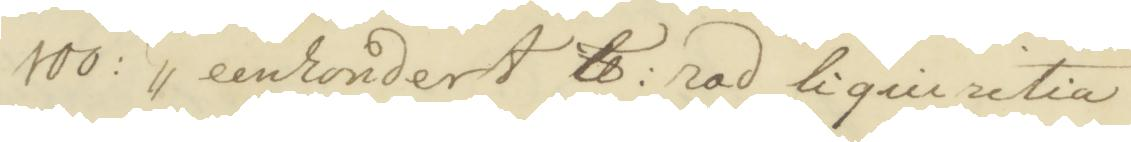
100: „ eenhondert lb: rad liquiritia
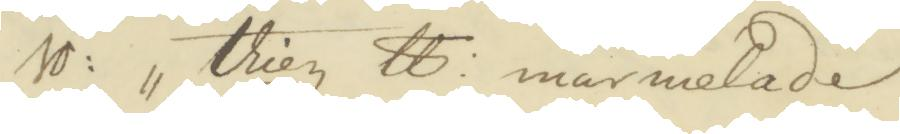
10: „ thien lb: marmelade
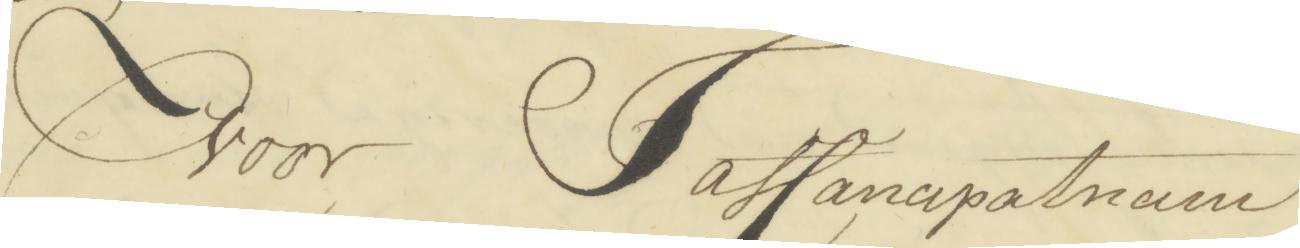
Voor Tassanapatnam
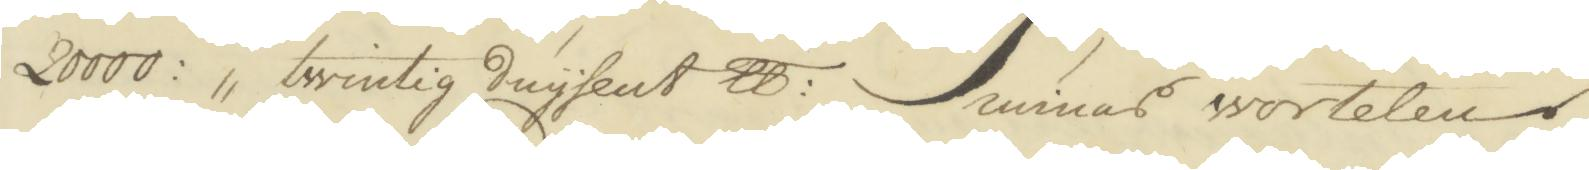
20000: „ twintig duijsent lb: ruinas wortelens
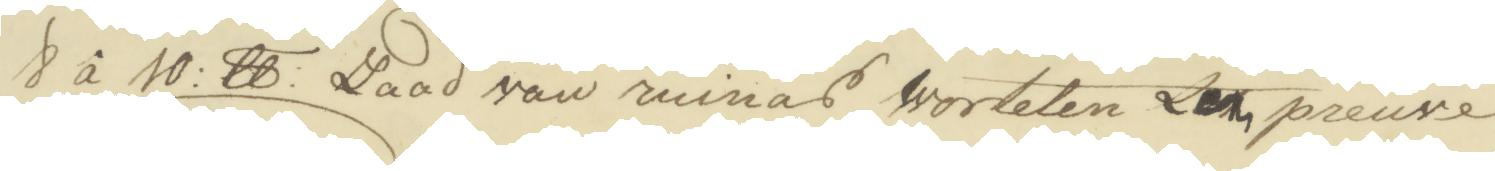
8 â 10: lb: zaad van ruinas wortelen ter preuve
